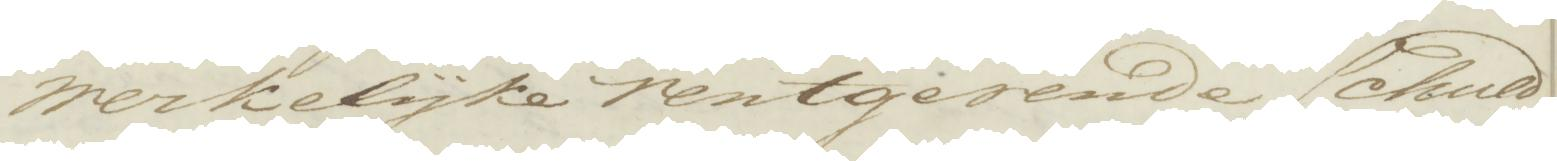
werkelijke rentgevende schuld,
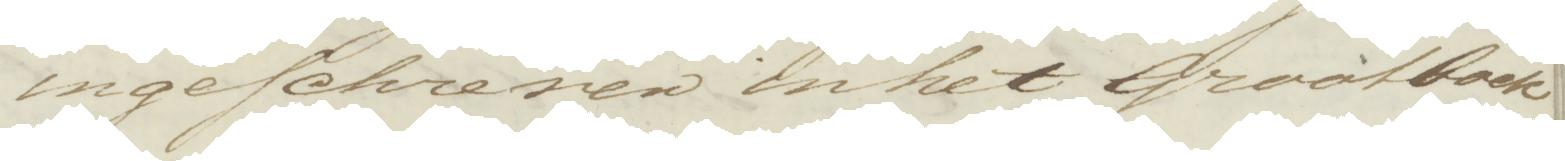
ingeschreven in het Grootboek
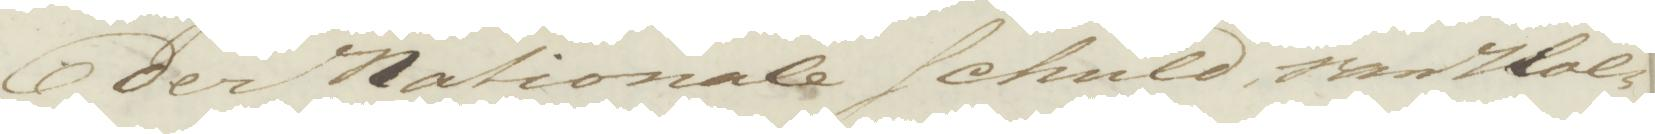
der Nationale schuld, van Hol
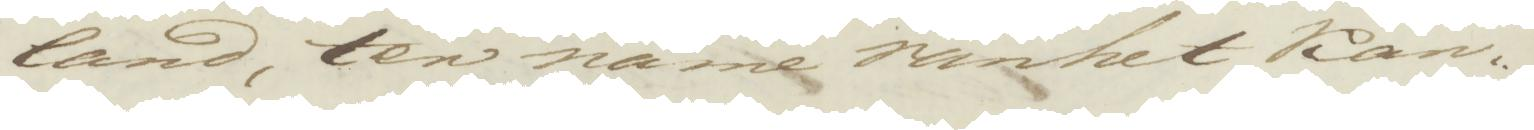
land, ten name van het Kan„
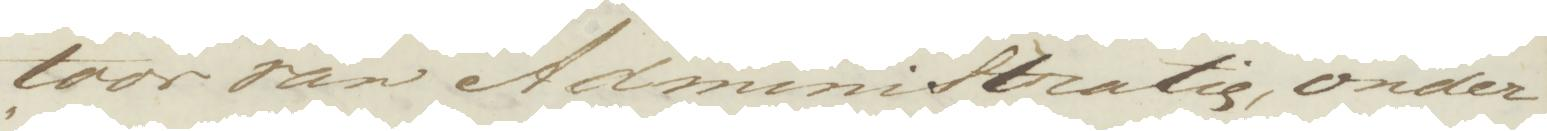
„toor van Administratie, onder
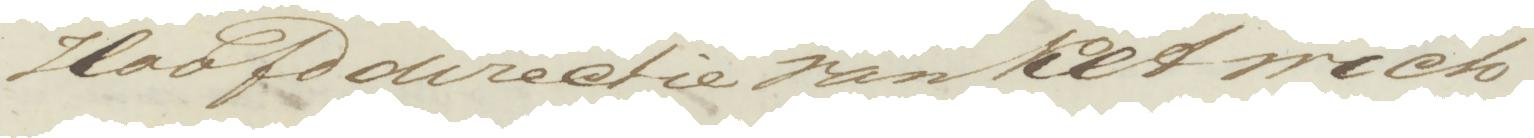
Hoofddirectie van Ketwich
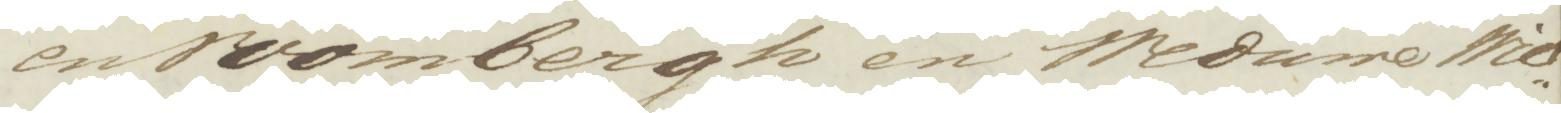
en voombergh en weduwe Wil„
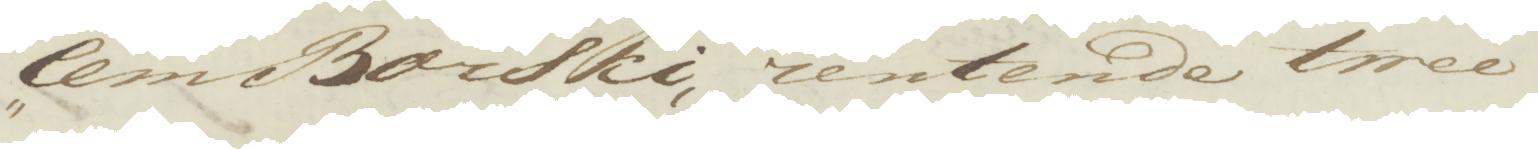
„lem Borski, rentende twee
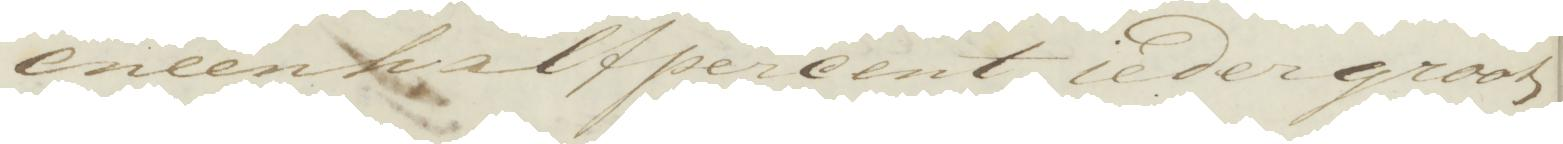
en een half percent, ieder groot
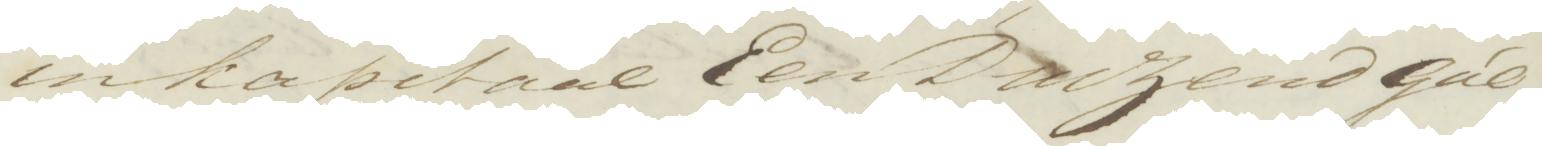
in kapitaal Een Duizend gul
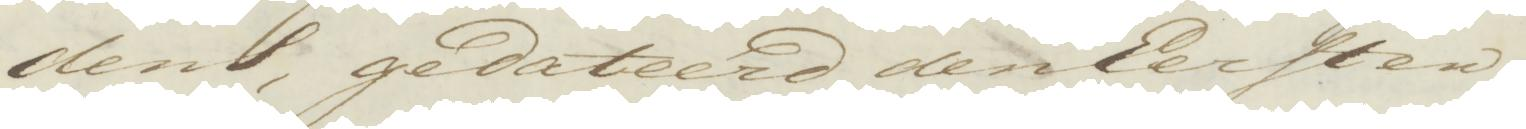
dens, gedateerd den Eersten
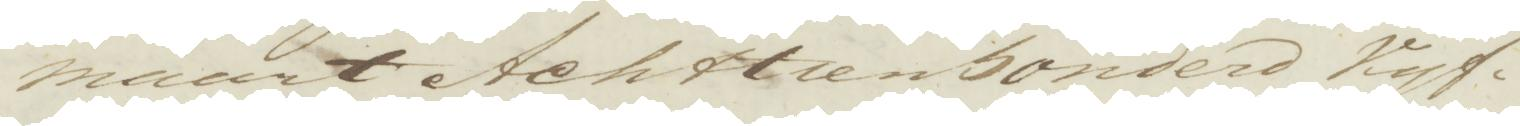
maart Achttienhonderd Vyf„
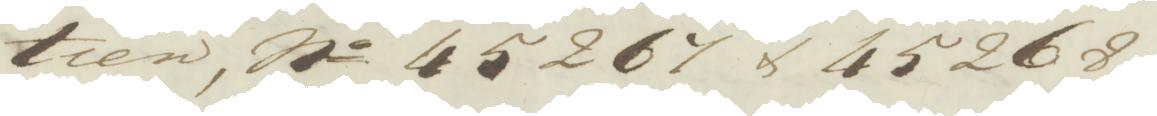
tien, N=o 45267 & 45268.
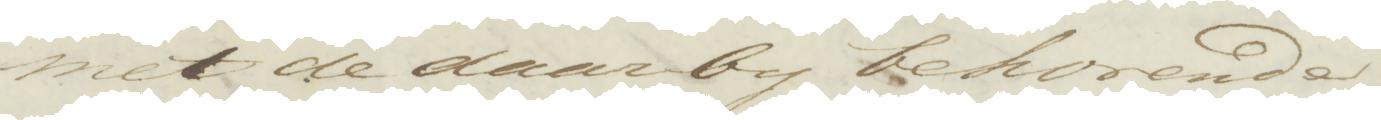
met de daarby behorende
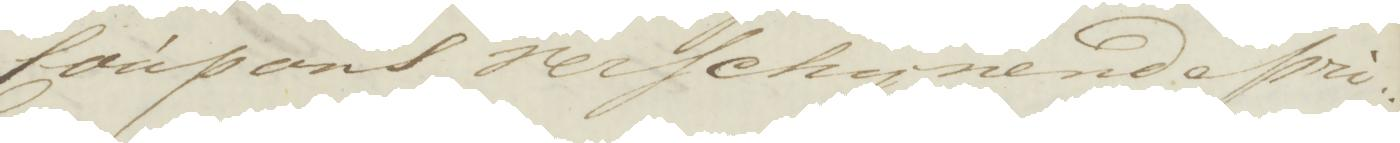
Coupons verschynende pri„
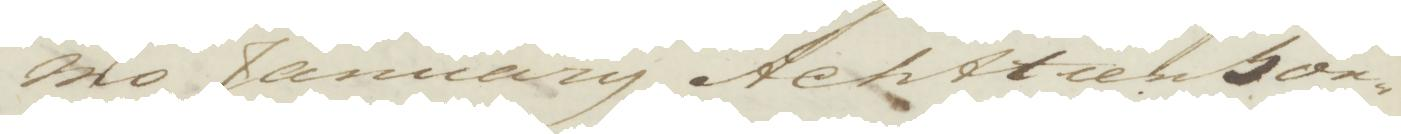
mo January Achttienhon„
